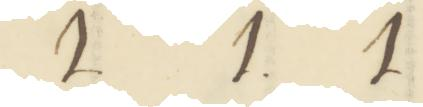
1. 1. 1
